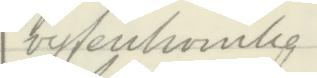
vyf entwintig
